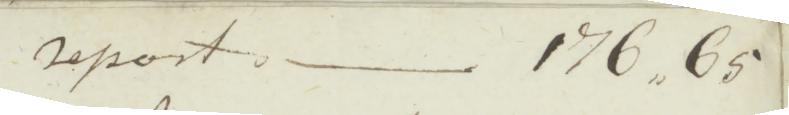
report. — 176„65
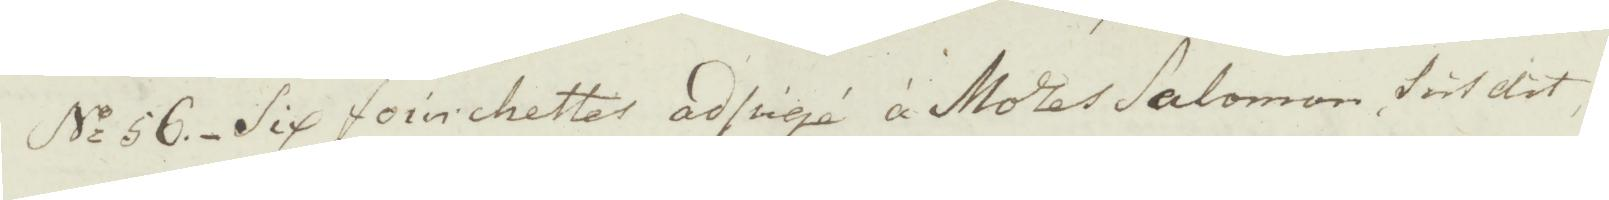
N=o 56. - Six fourchettes adjugé à Moses Salomon, Sus dit,
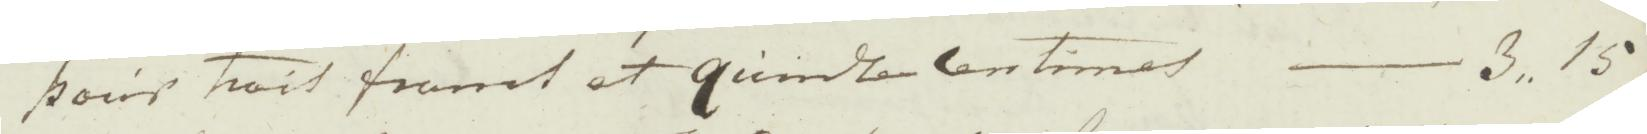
pour trois francs et quinze Centimes — 3„ 15
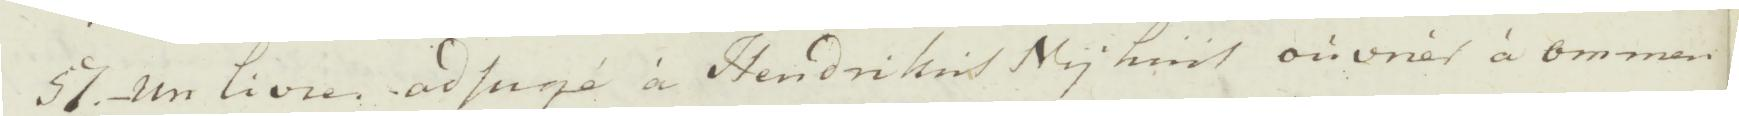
57.-un livre-adjugé à Hendrikus Nijhuis ouvrier à Ommen
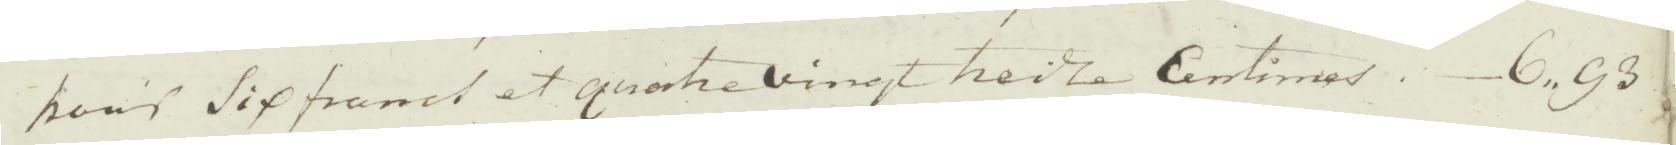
pour six francs et quatre vingt treize Centimes . — 6 „ 93
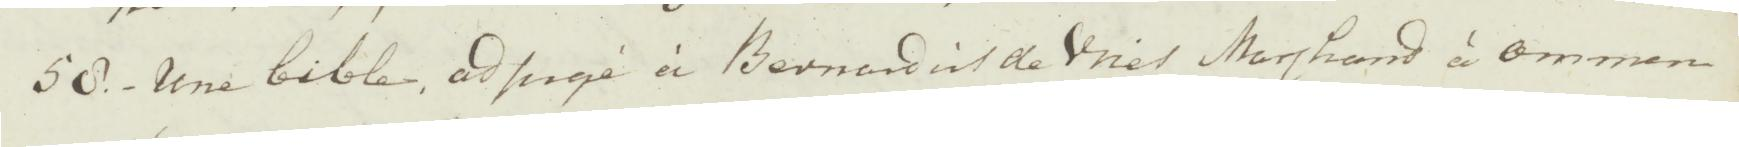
58.- Une bible, adjugé à Bernardus de Vries Marchand à Ommen
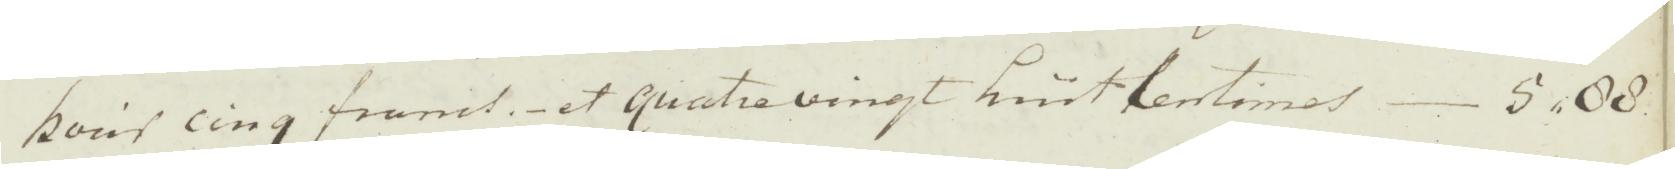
pour cinq franis. - et quatre vingt huit Centimes — 5„88.
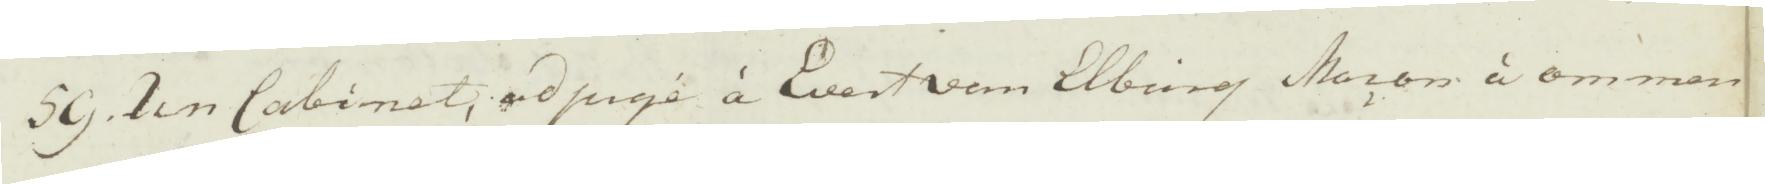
59. Un Cabinet; adjugé à Evert van Elburg Maçon á ommen
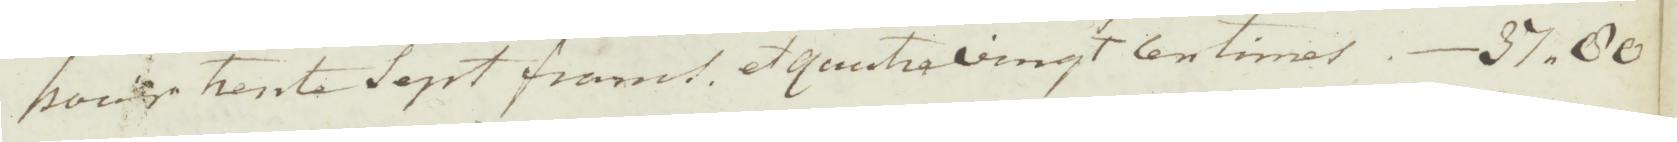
pour trente Sept francs, et quatre vingt Centimes. — 37„80
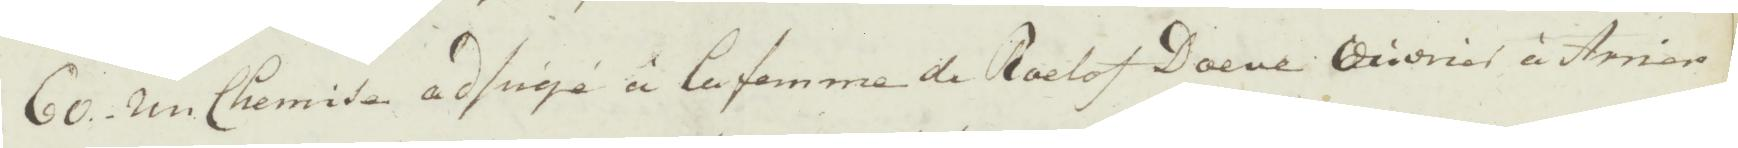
60.- un Chemise adjugé à la femme de Roelof Doeve Ouvrier à Arrien
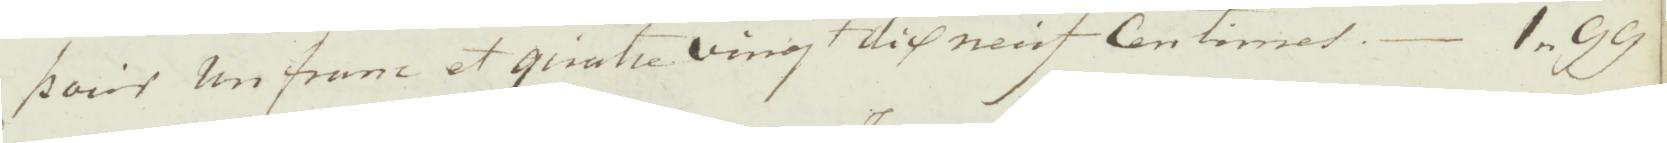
pour un franc et quatre vingt dix neuf Centimes. — 1„99
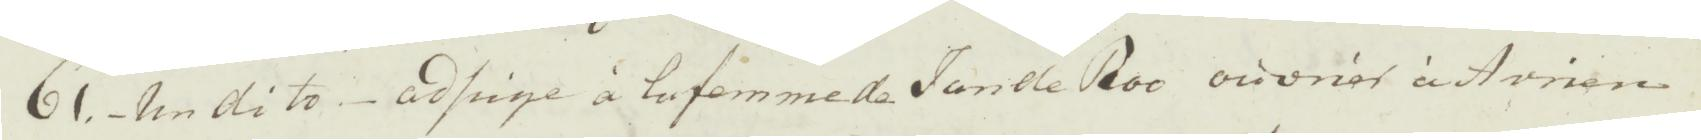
61.-un dito. - adjugé à la femme de Ian de Roo ouvriér à Arrien
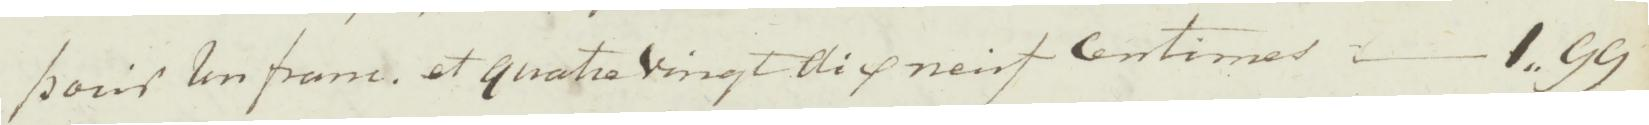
pour un franc. et quatre vingt dix neuf Centimes — 1„99
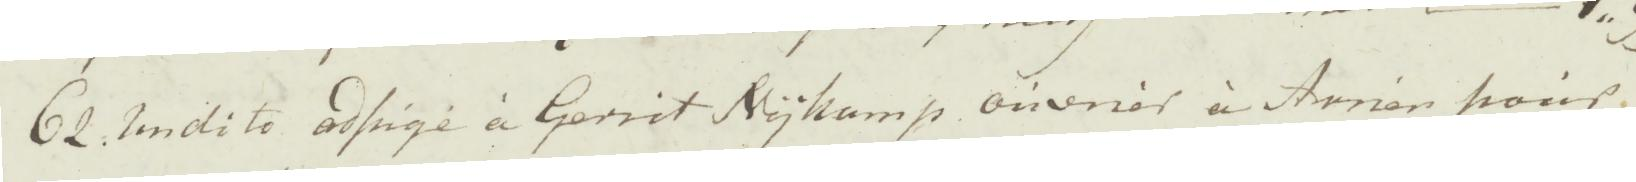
62. un dito adjugé à Gerrit Nijkamp ouvrier à Arrien pour
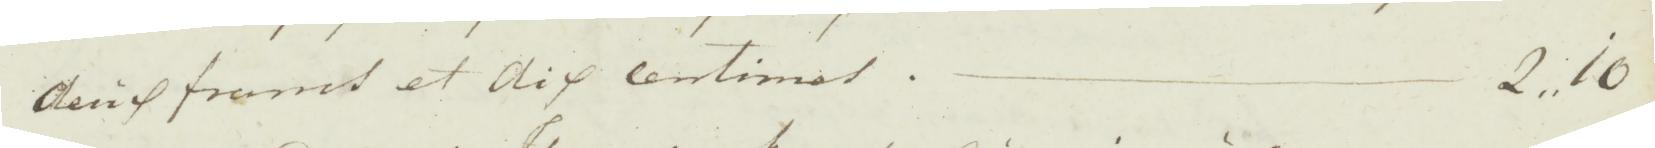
deux francs et dix Centimes. — 2„10
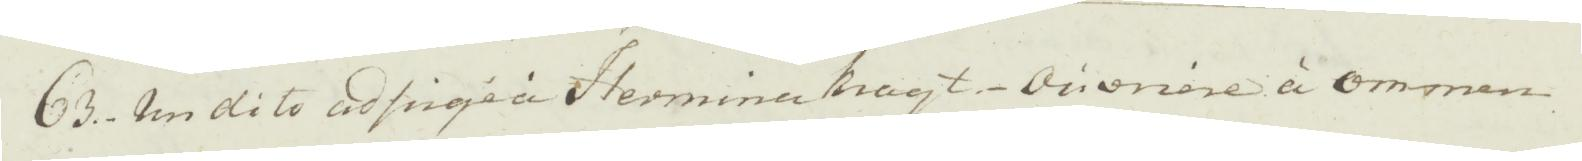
63.- un dito adjugé à Hermina Kragt.- Ouvrière à Ommen
